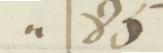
„ 85
